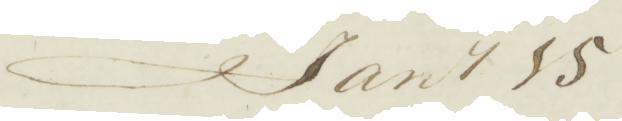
Jan 15
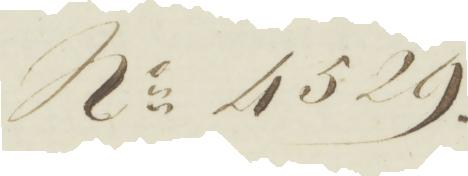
N=o 4529
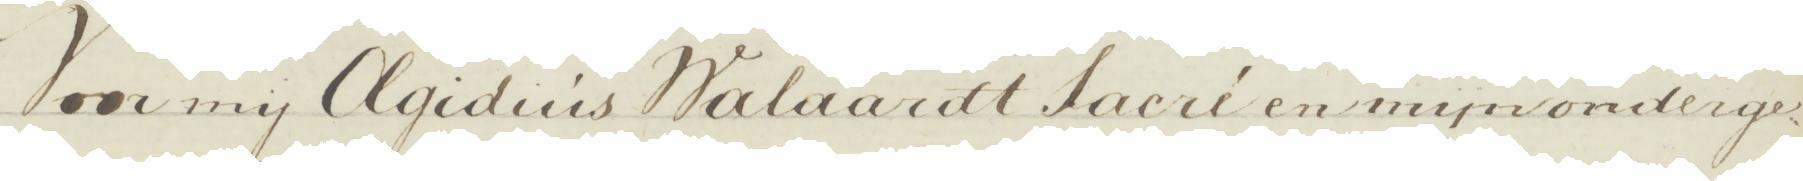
Voor mij AEgidius Walaardt Sacré en mijn onderge
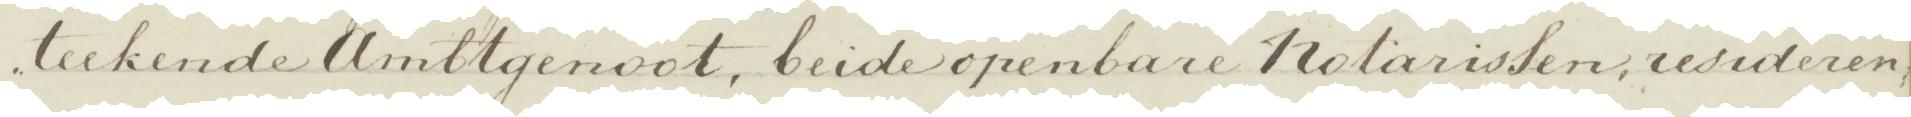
„teekende Ambtgenoot, beide openbare Notarissen, resideren
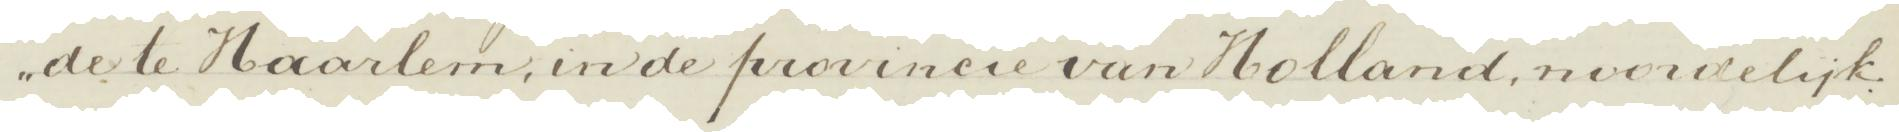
„de te Haarlem, in de provincie van Holland, noordelijk
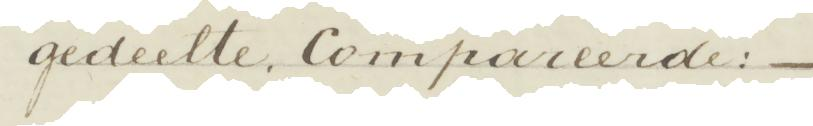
gedeelte, Compareerde:
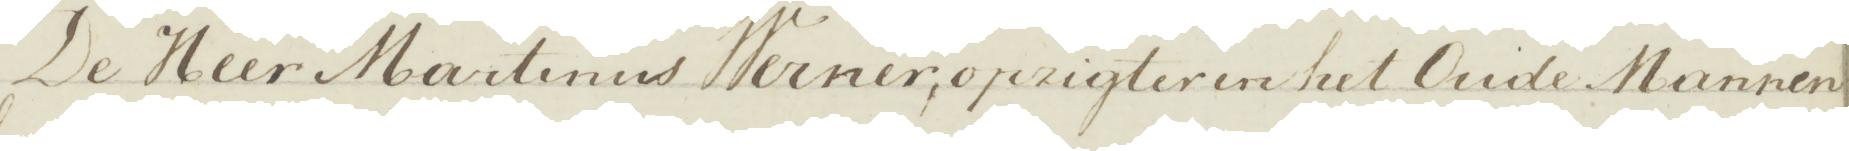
De Heer Martenus Werner, opzigter in het Oude Mannen
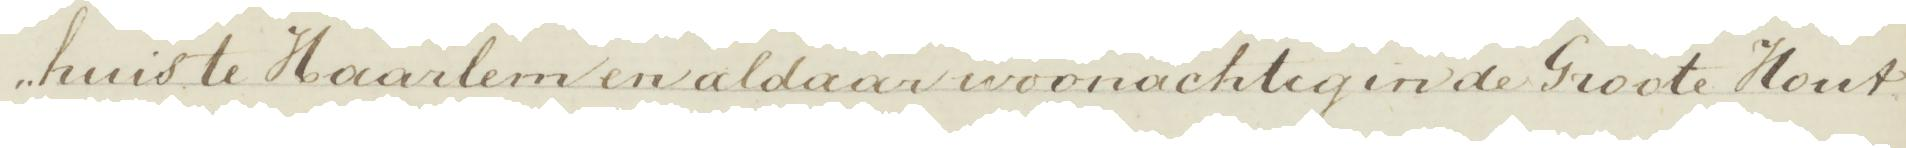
„huis te Haarlem en aldaar woonachtig in de Groote Hout
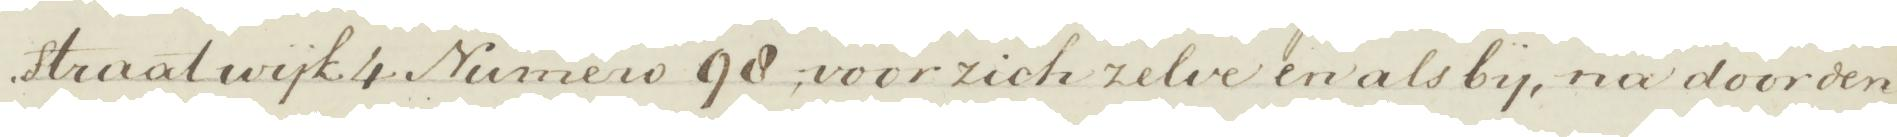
.straat wijk 4 Numero 98, voor zich zelve en als bij, na door den
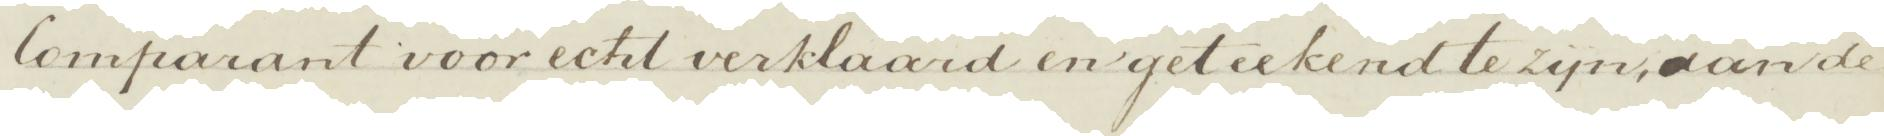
Comparant voor echt verklaard en geteekend te zijn, aan de
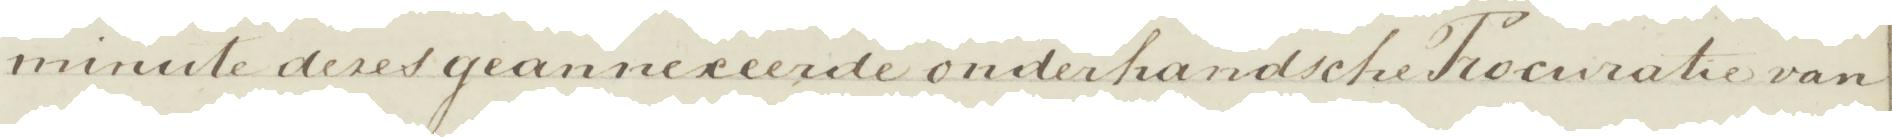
minute dezes geannexeerde onderhandsche Procuratie van
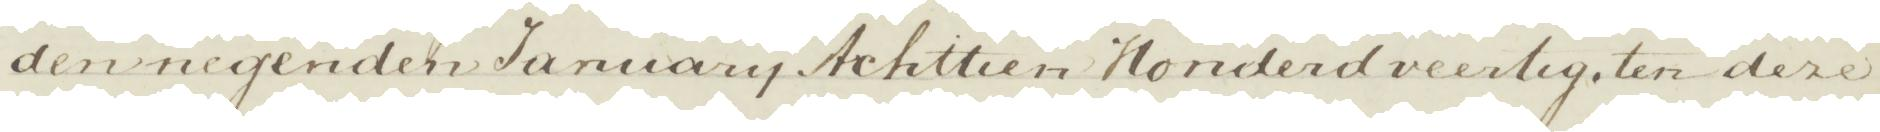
den negenden Januarij Achttien Honderd veertig, ten deze
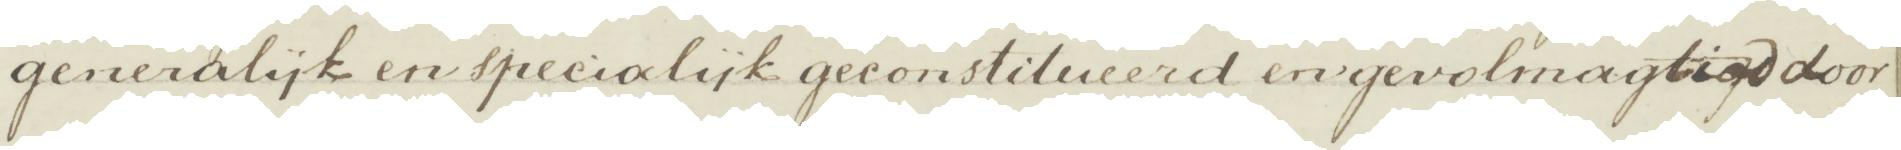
generalijk en specialijk geconstitueerd en gevolmagtigd door
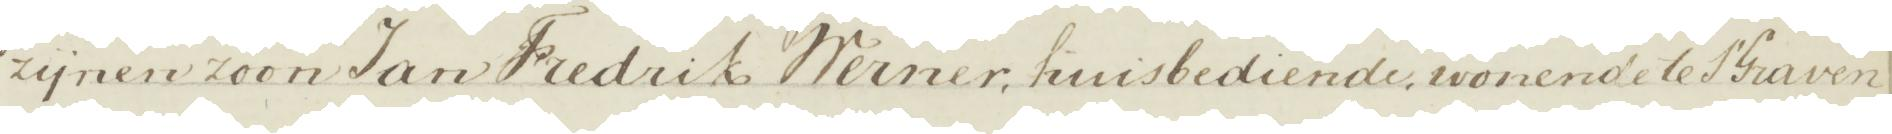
zijnen zoon Jan Fredrik Werner, huisbediende, wonende te s'Graven
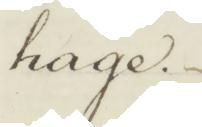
hage.
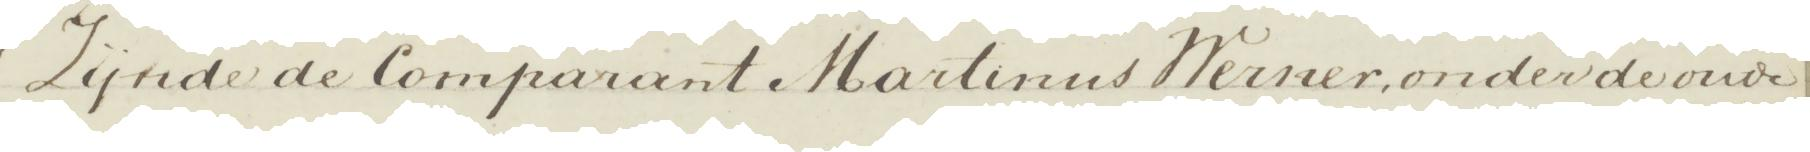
Zijnde de Comparant Martinus Werner, onder de oude
